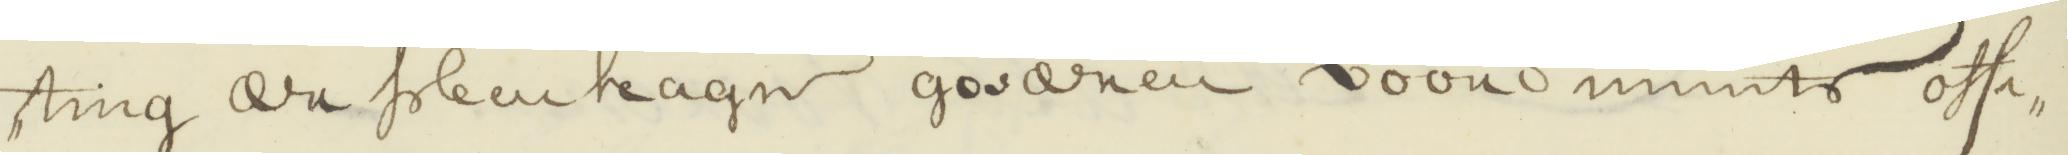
„ting der schenkagie goederen voor d' munts offi„
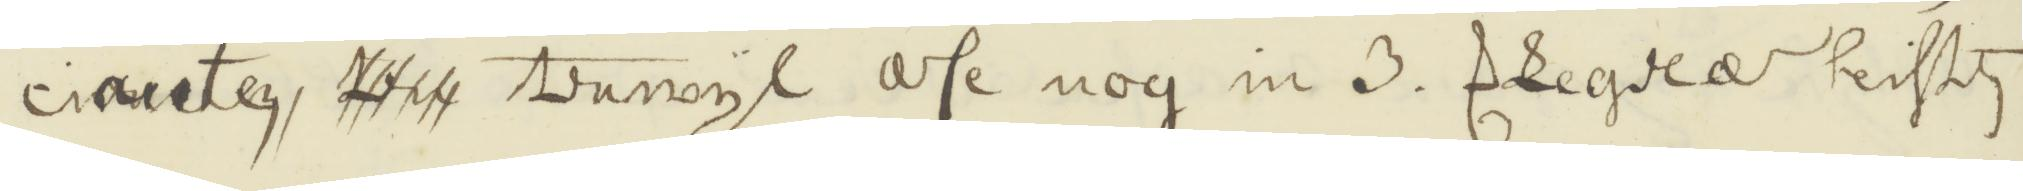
cianten, ten terwijl dese nog in 3. verzegelde kisten
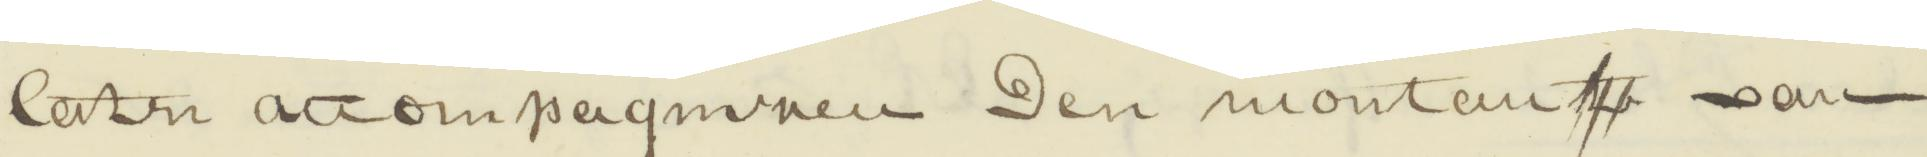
laten accompagneren den montante van
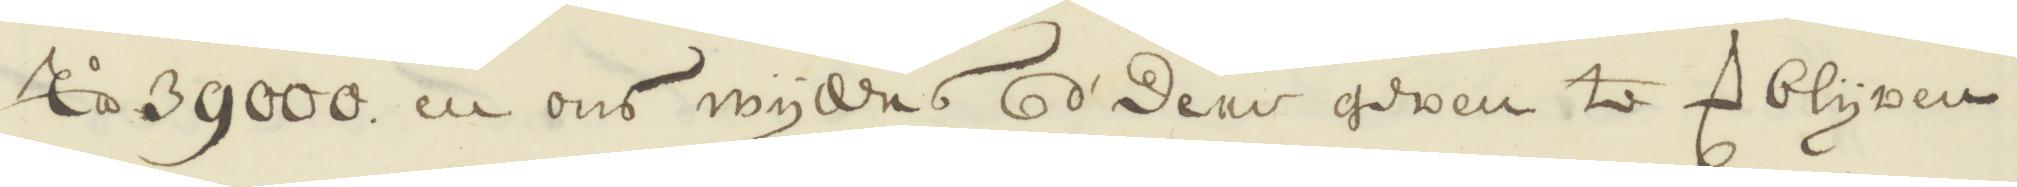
ro/a 39000. en ons wijders d’Eere geven te verblijven
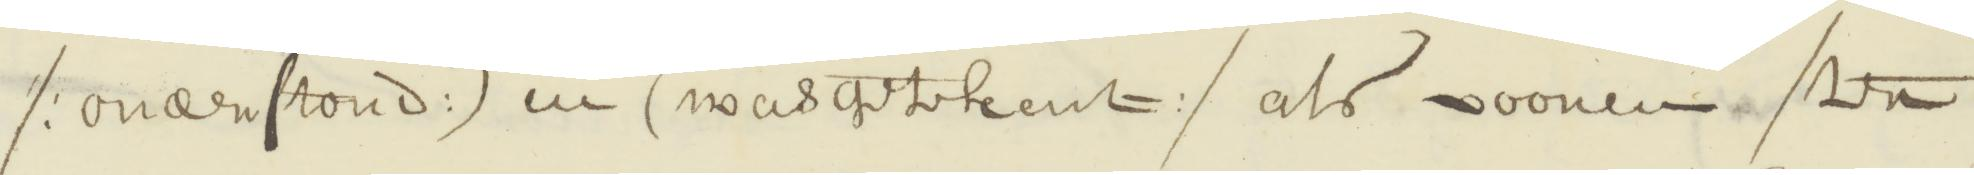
/: onderstond:) in (was getekent :/ als vooren /ter
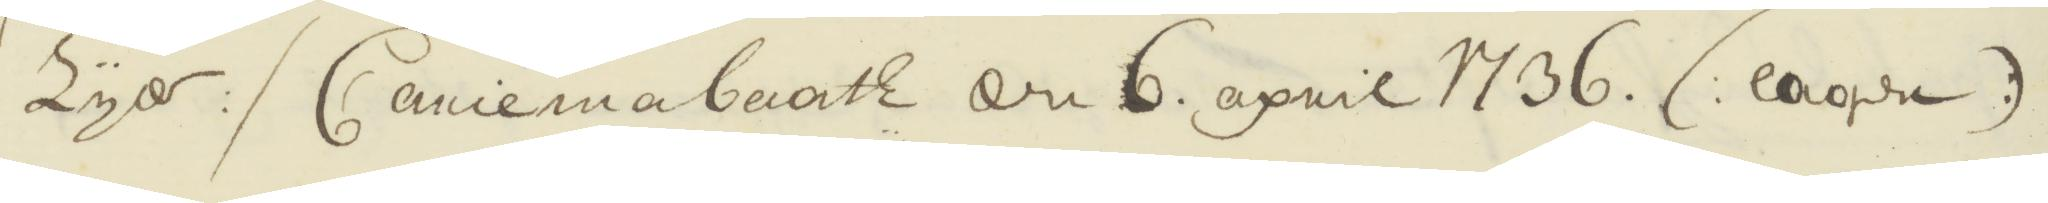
zijde:/ Cariemabaath den 6. april 1736. (:lager:)
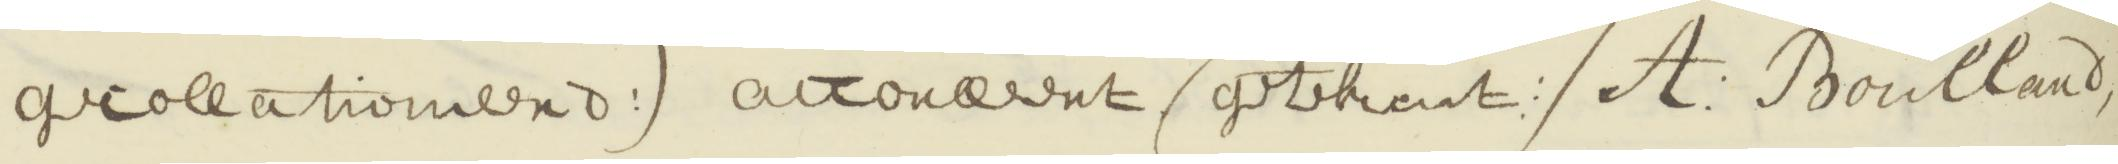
gecollationeerd:) accordeert (getekent :/ A: Boullard,
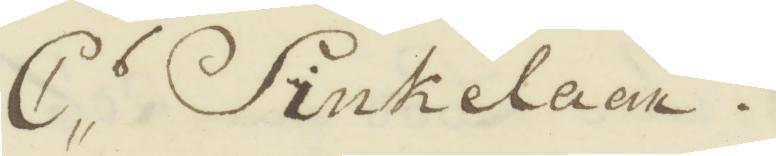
C„s Sinkelaar.
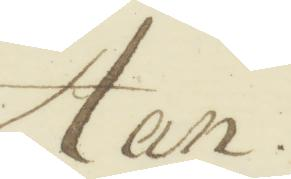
Aan.
